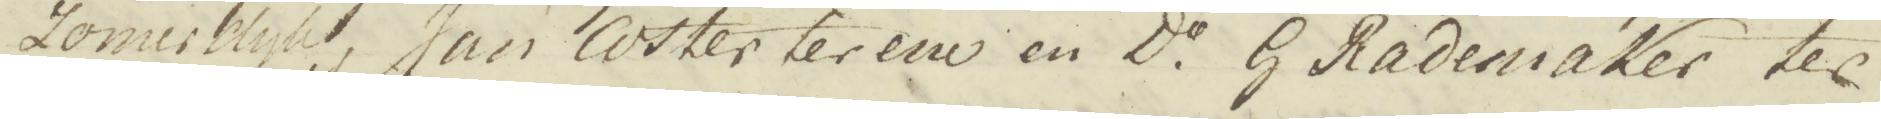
Zomerdyk Jan Coster ter ene en D.o G Rademaker ter
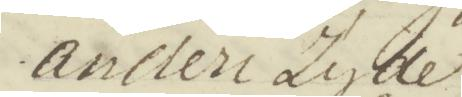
andere Zyde
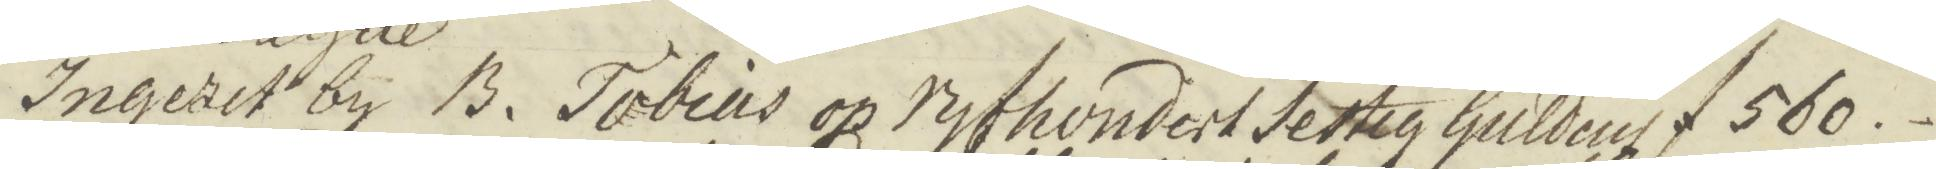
Ingezet by B. Tobias op vyfhondert sestig Guldens ƒ 560. -
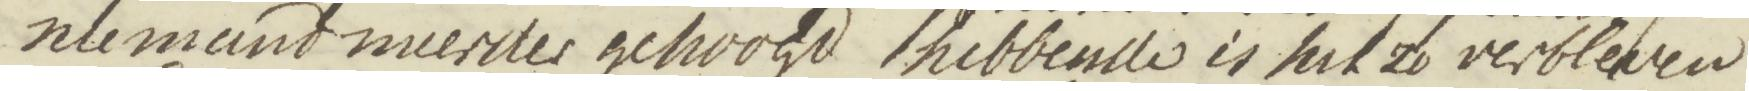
niemand meerder gehoogd hebbende is het zo verbleven
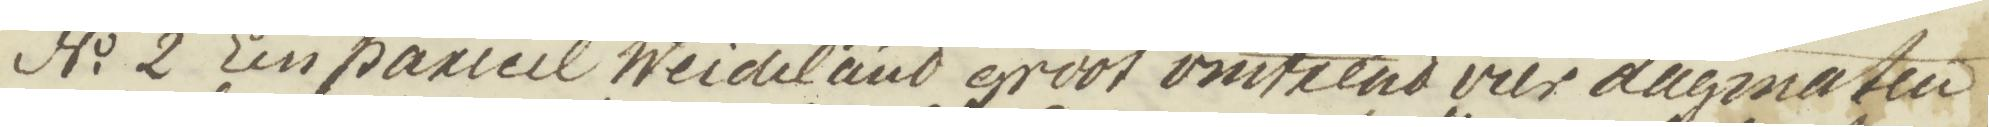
N:o 2 Een parceel Weideland groot omtrend vier dagmaten
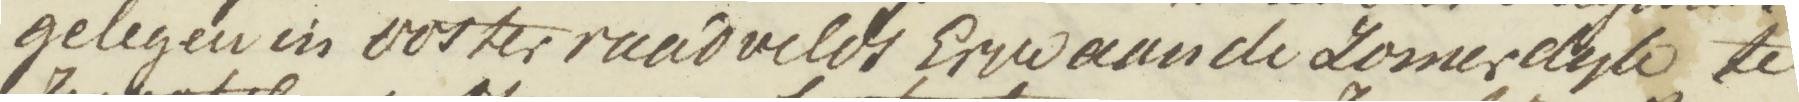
gelegen in ooster raadvelds Erve aan de Zomerdyk te
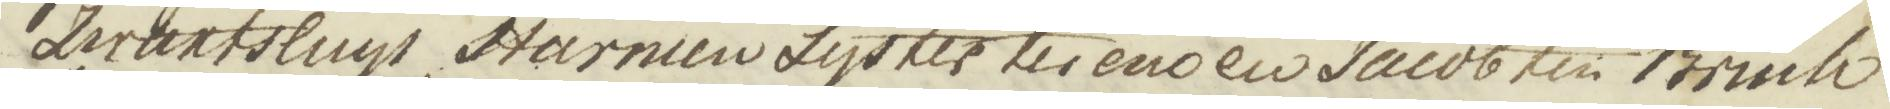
Zwartsluys Harmen Lyster ter ene en Jacob ten Brink
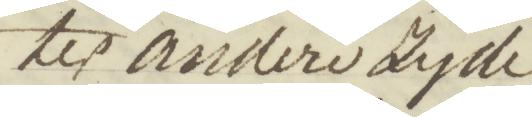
ter andere Zyde
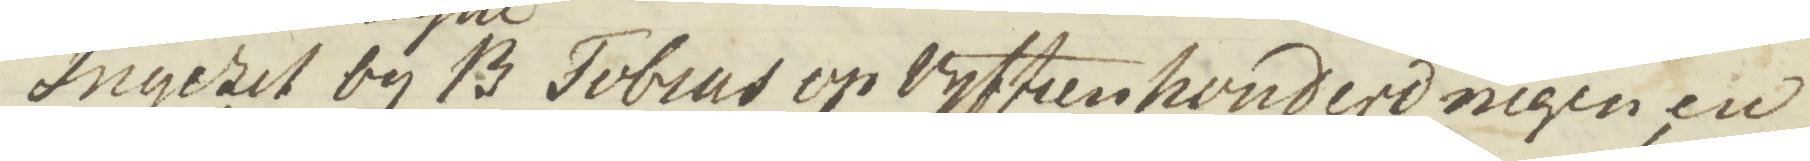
Ingezet by B Tobias op Vyftien honderd negen en
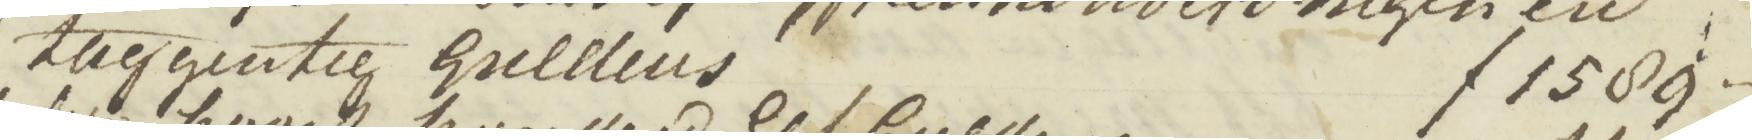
taggentig Guldens ƒ 1589.-
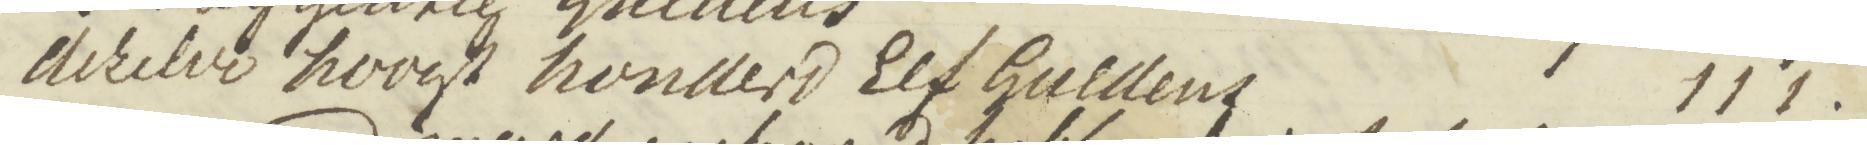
dezelve hoogt honderd Elf Guldens 111.
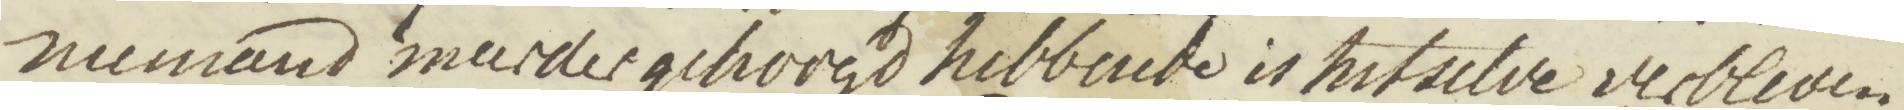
niemand meerder gehoogd hebbende is hetselve verbleven
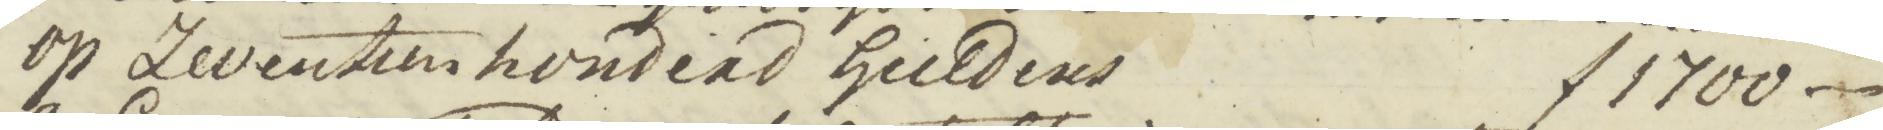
op Zeventien honderd Guldens ƒ 1700 —
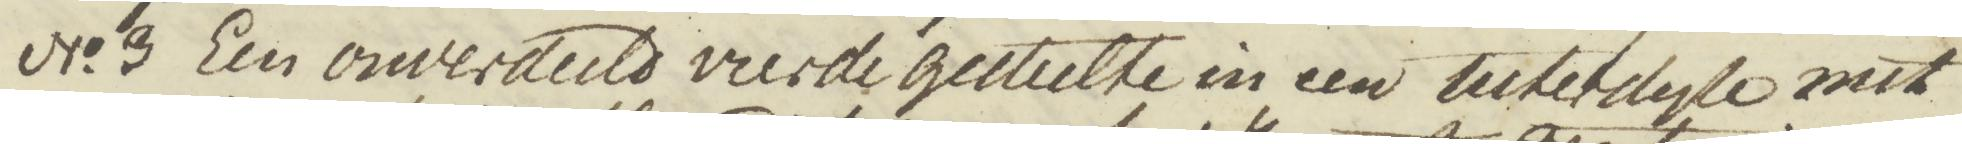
N.o 3 Een onverdeeld vierde gedeelte in een uiterdyk met
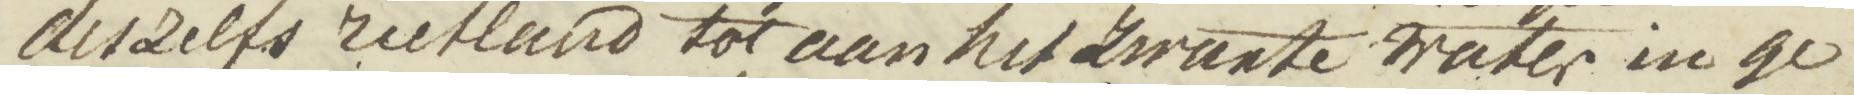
deszelfs rietland tot aan het Zwarte Water in ge
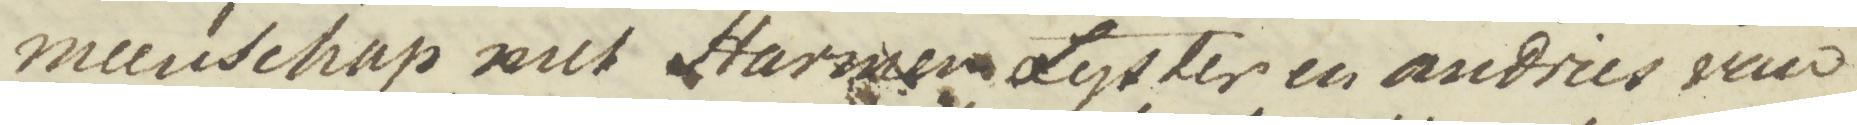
meenschap niet Harmen Lyster en andries van
